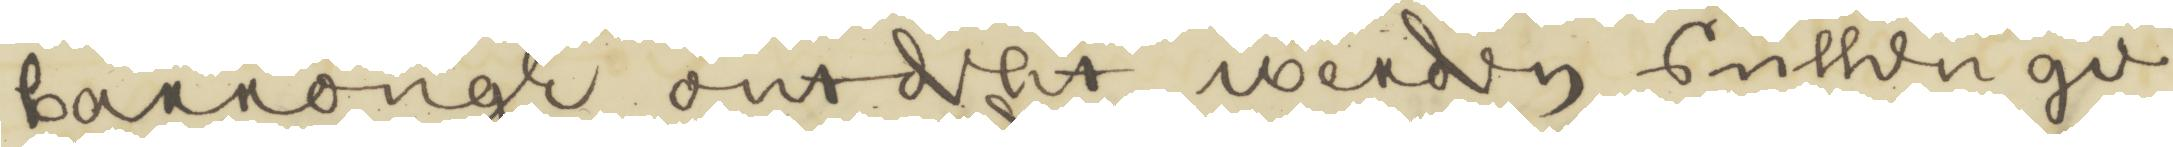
barrongh ontdekt werden sullen ge
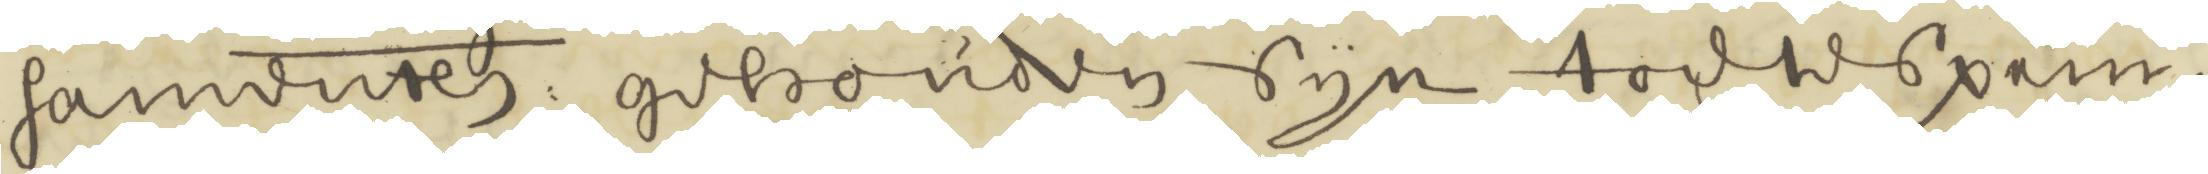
samentelijk gehouden sijn toe te sprin„
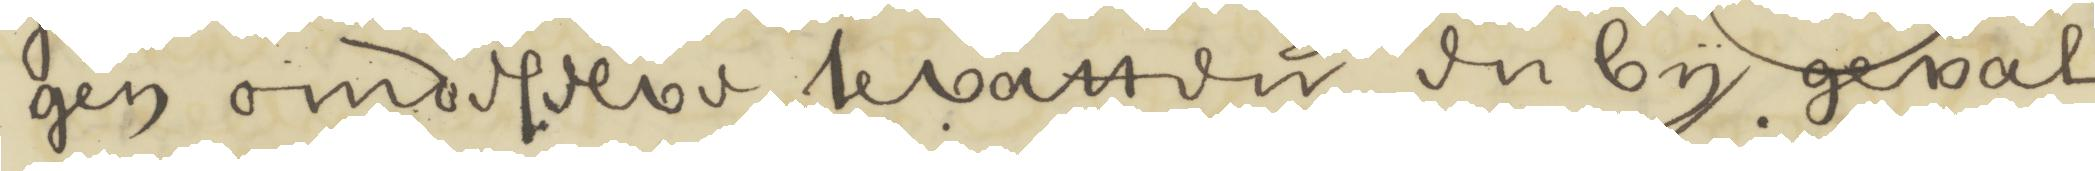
gen om deselve te vatten en bij geval
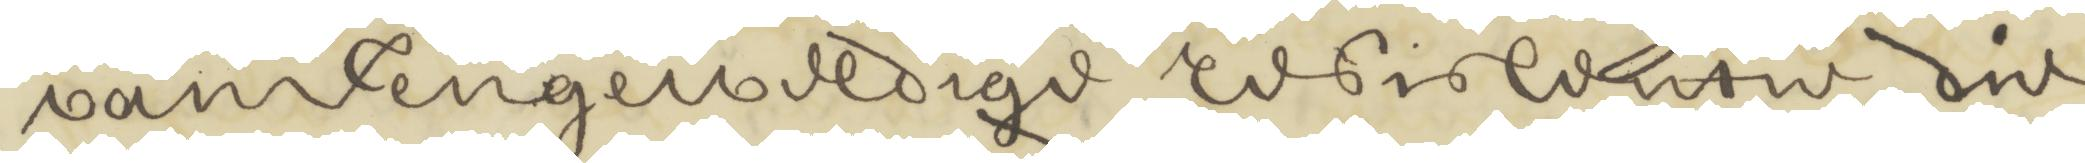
van Een geweldige resistentie die
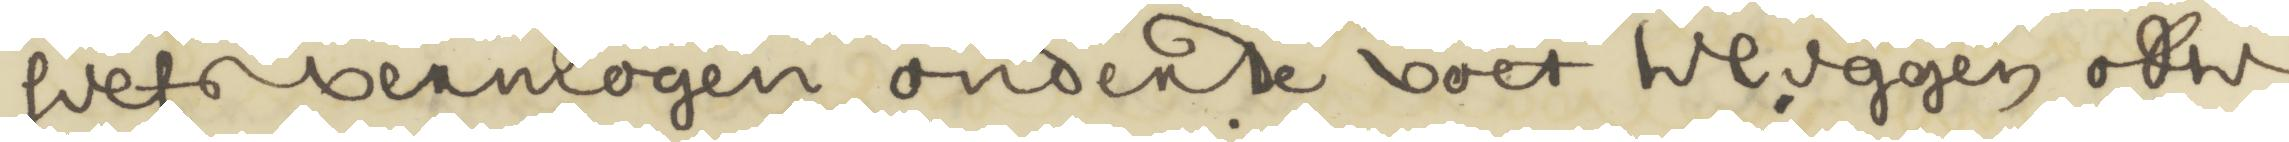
selfs vermogen onder de voet te leggen ofte
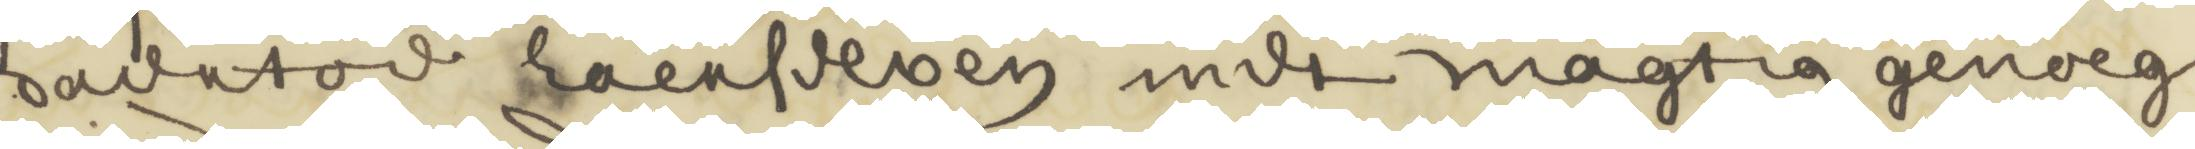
daertoe haerselven niet magtig genoeg
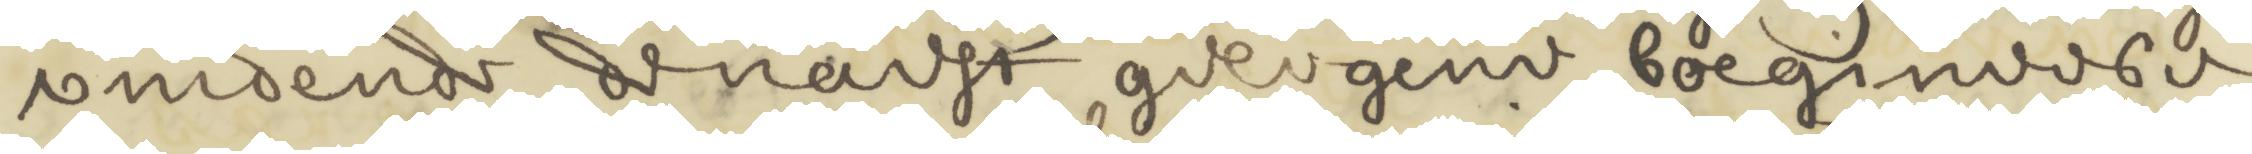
vindende de naest gelegene boegineesen
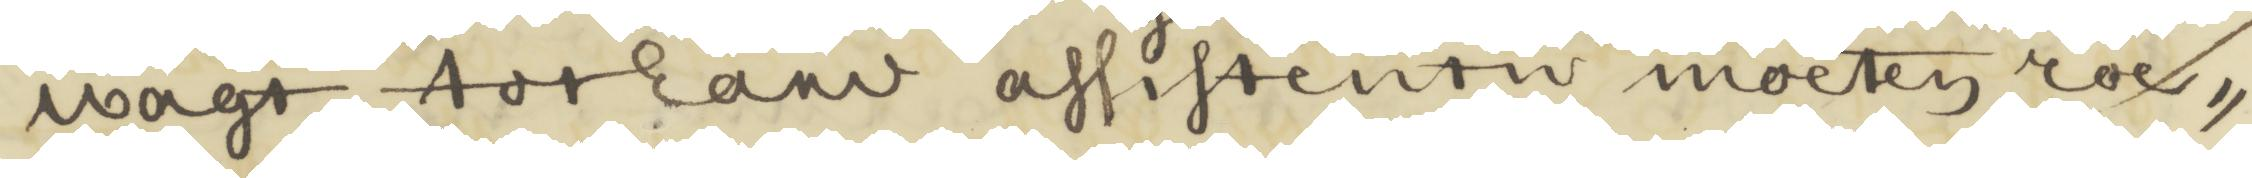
wagt tot hare assistentie moeten roe„
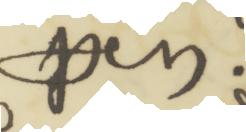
pen:
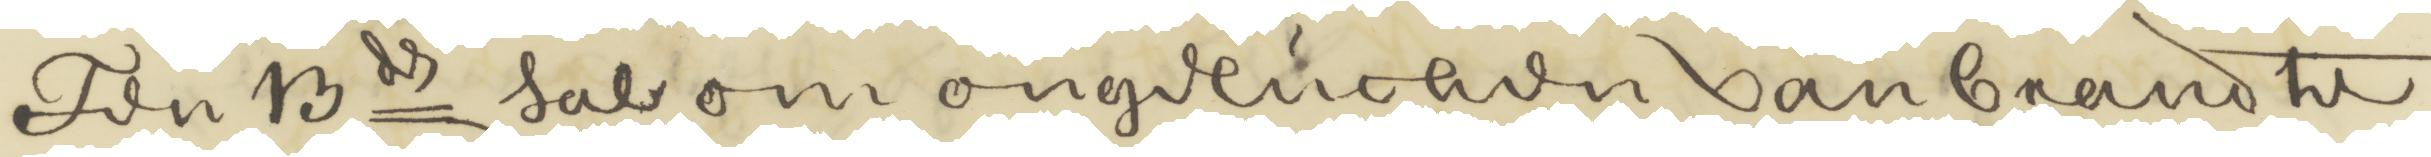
Ten 13=den sal om ongelucken van brand te
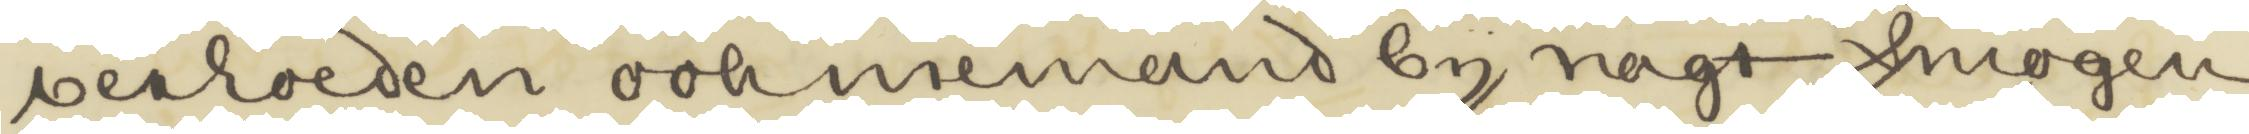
verhoeden ook niemand bij nagt vermogen
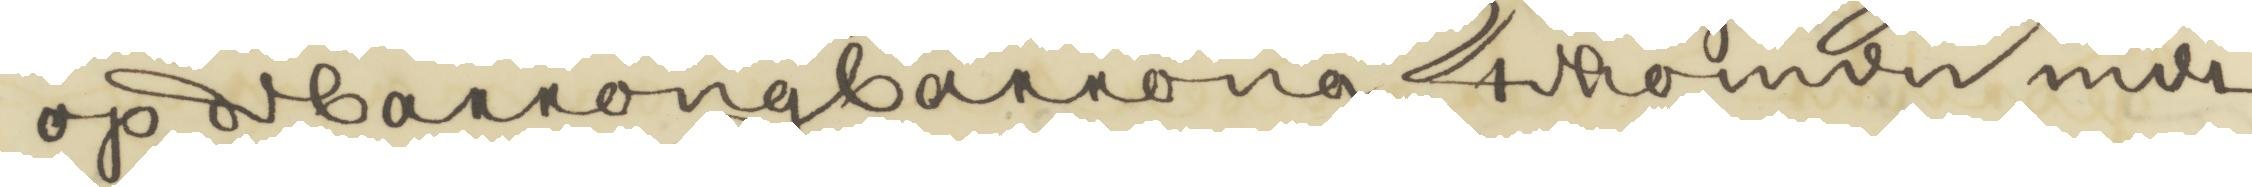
op de barrongbarrong te komen met
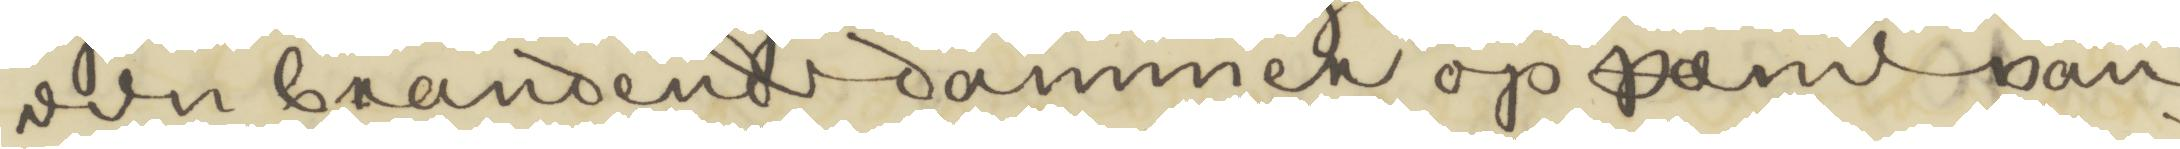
een brandende dammer op pane van
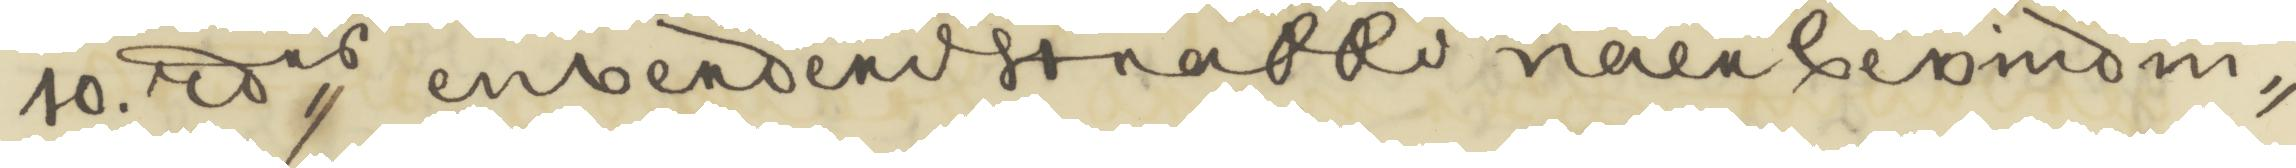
10. rd„rs en verdere straffe naer bevindin„
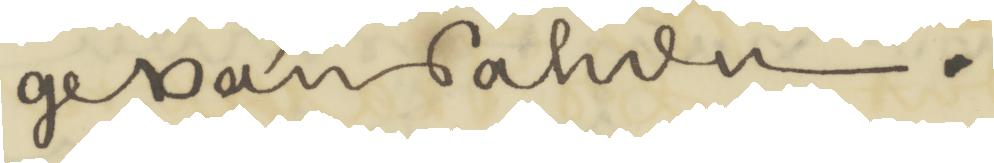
ge van saken.
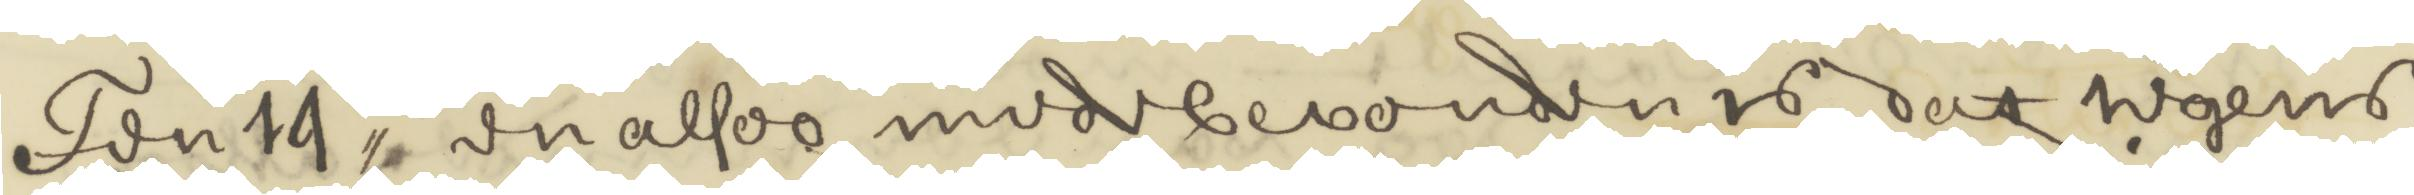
den 14„den en alsoo medebevonden is dat tegens
